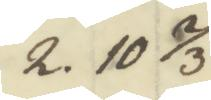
2. 10 2/3
